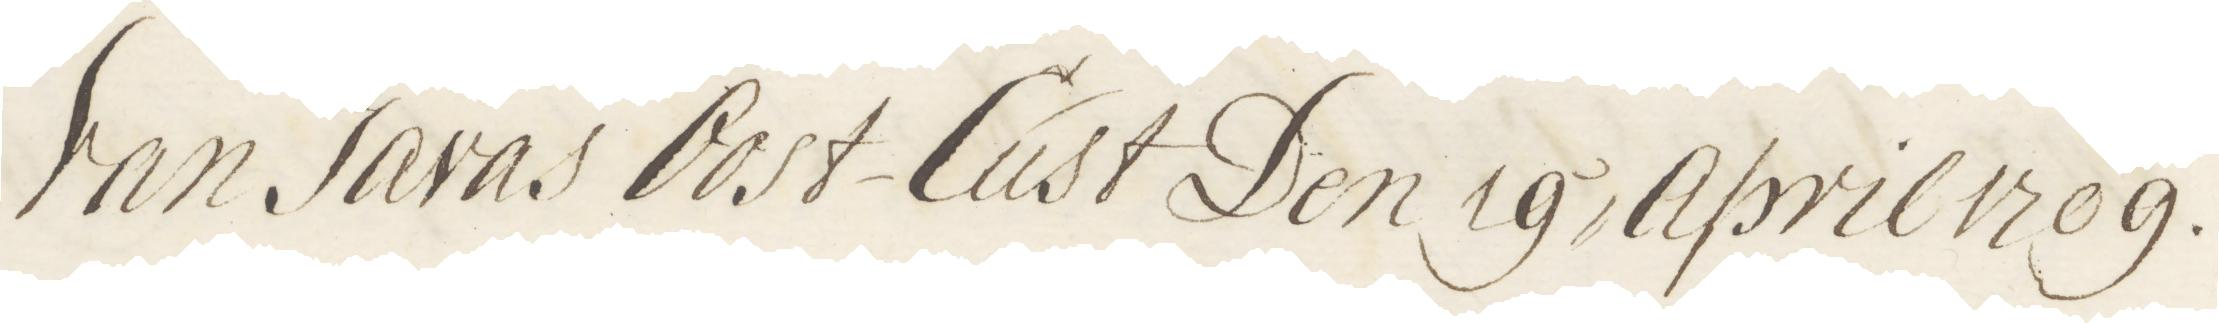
Van Iavas Oost-Cust Den 19„' April 1709.
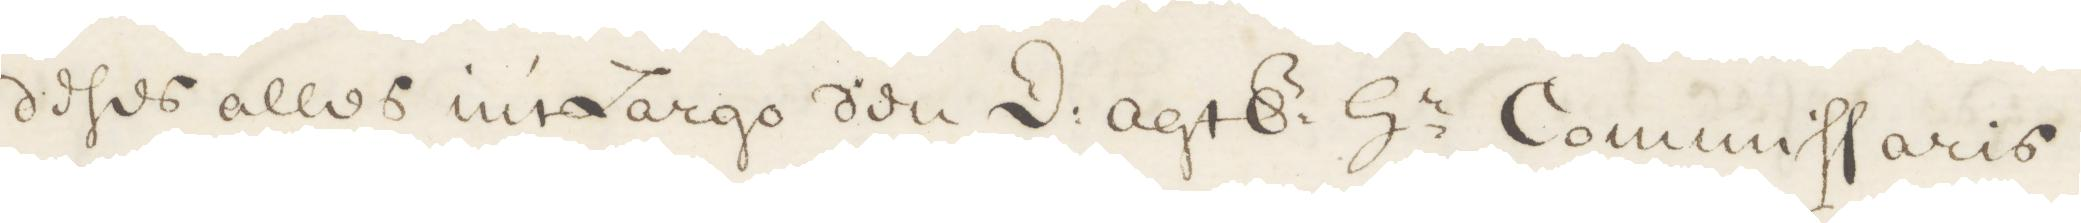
deses alles in't largo den E: agtb: h:r Commissaris
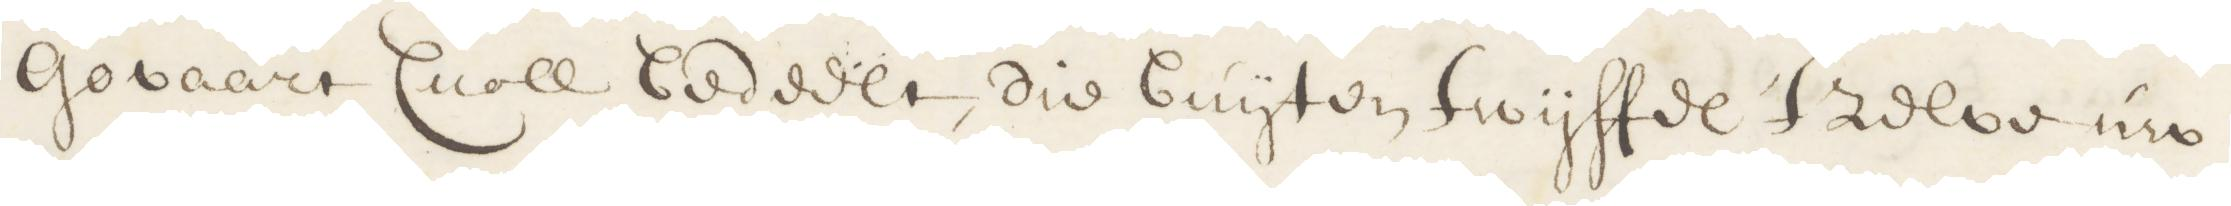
govaart Cnoll bedeelt, die buijten twijffel ’t zelve uw
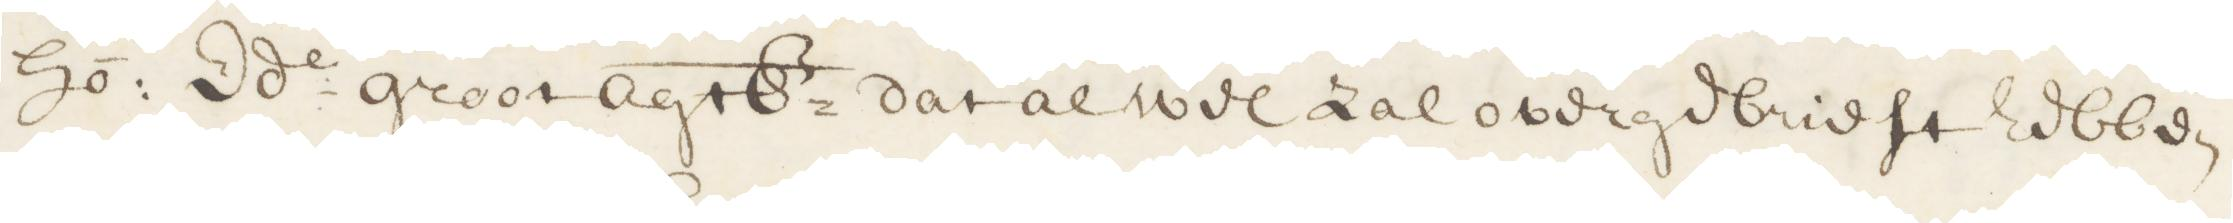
Ho: Ed:e groot agtb= dat al wel zal overgebrieft hebben
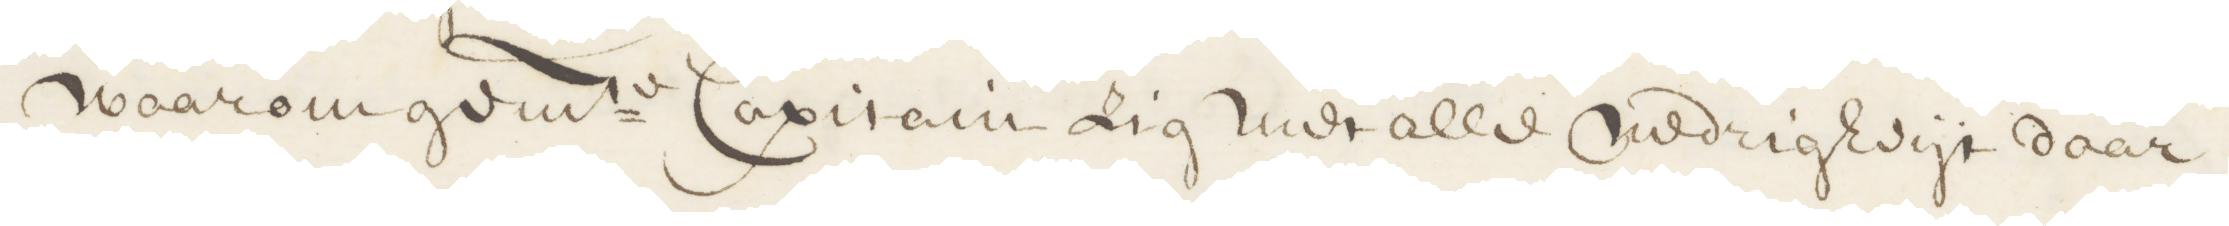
waarom gem=te Capitain zig met alle nedrigheijt daar
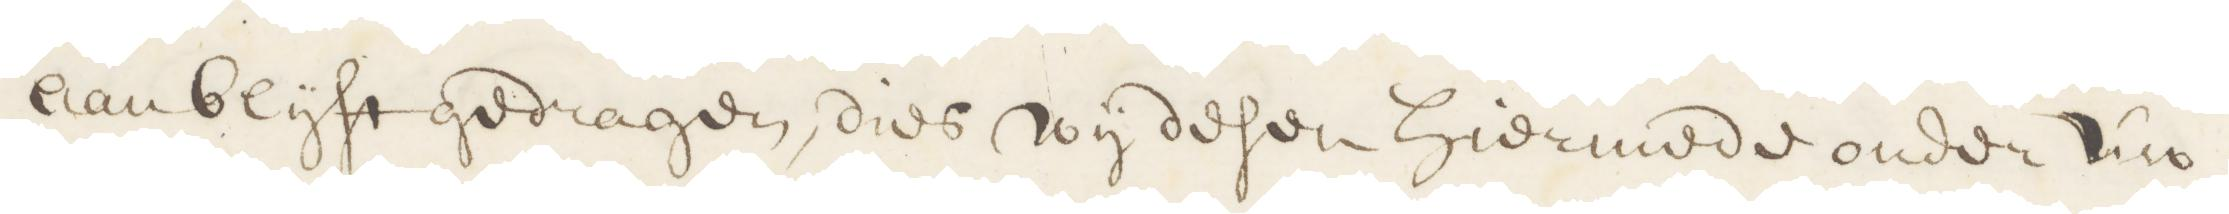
aan blijft gedragen, dies wij desen hiermede onder uw
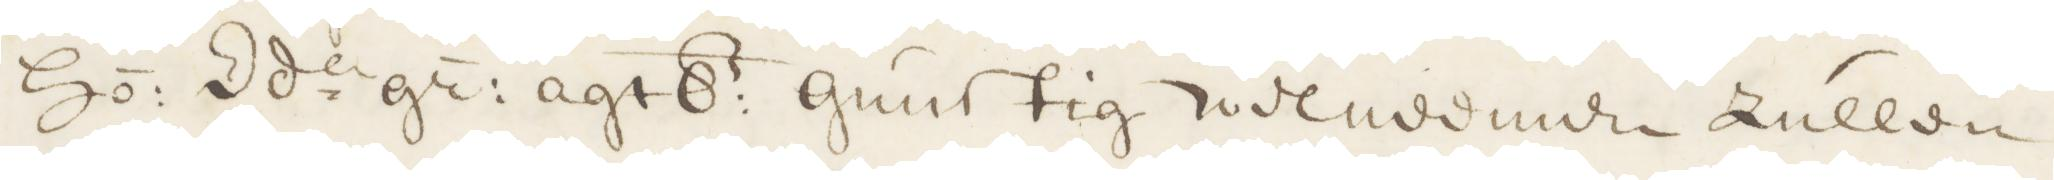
Ho: Ed:en gr: agtb: gunstig welneemen zullen
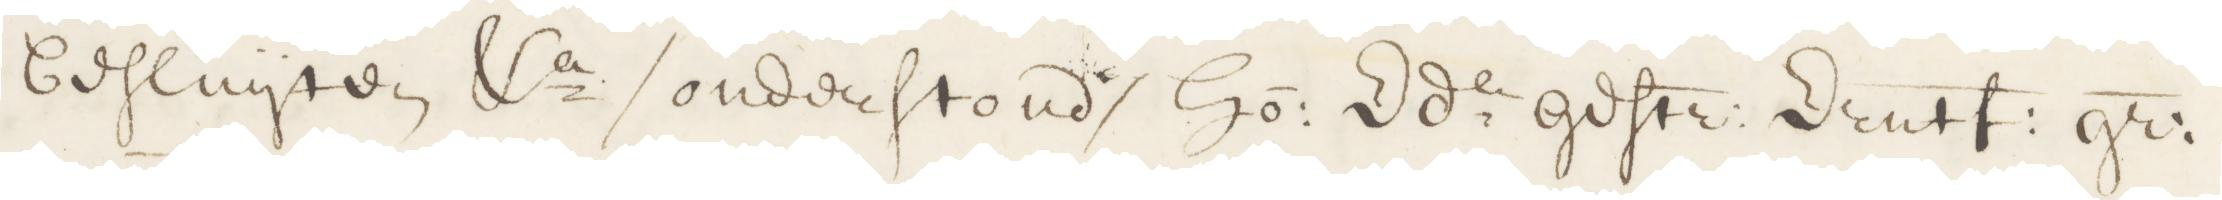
besluijten &=a /onderstond/ Ho: Ed:en gestr: Erntf: gr:
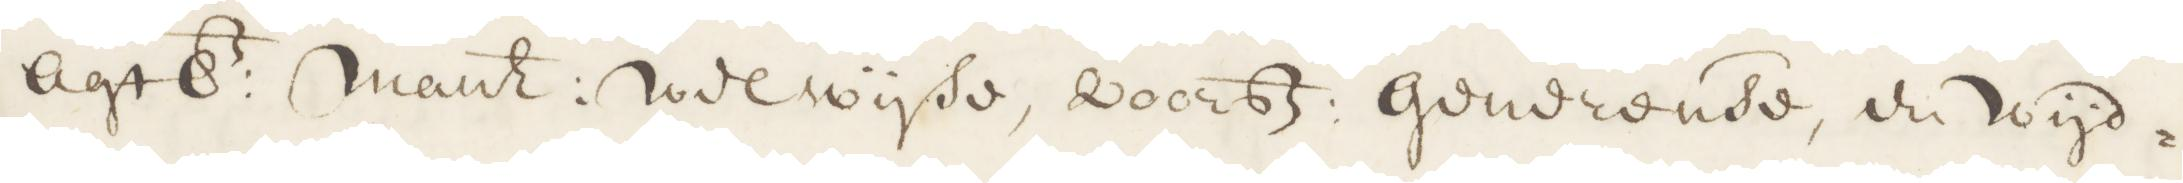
agtb: manh: wel wijse, voors: genereuse, en wijd=
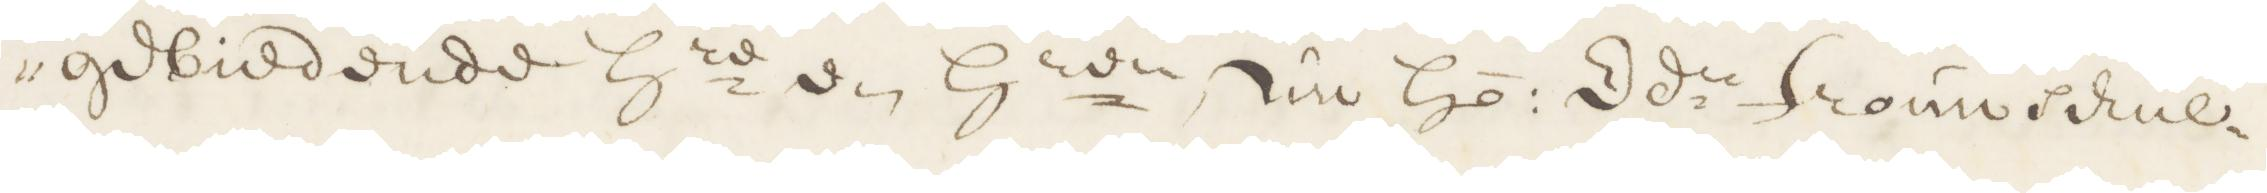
„gebiedende H=re en H=ren, uw Ho: Ed=n trouw schul=
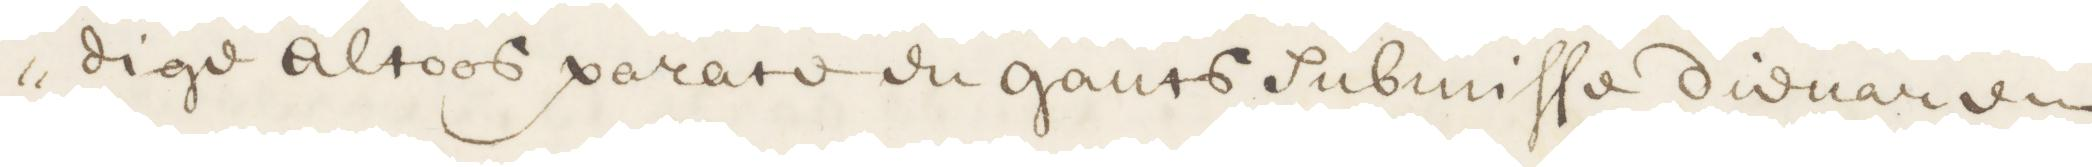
„dige altoos parate en gants submisse dienaren
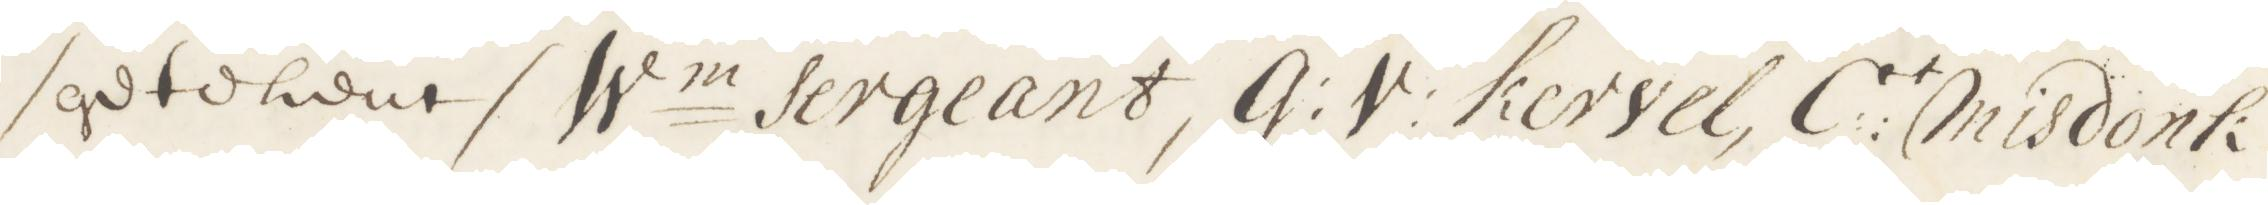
/getekent/ W=m sergeant, G: V: kervel, C::t misdonk
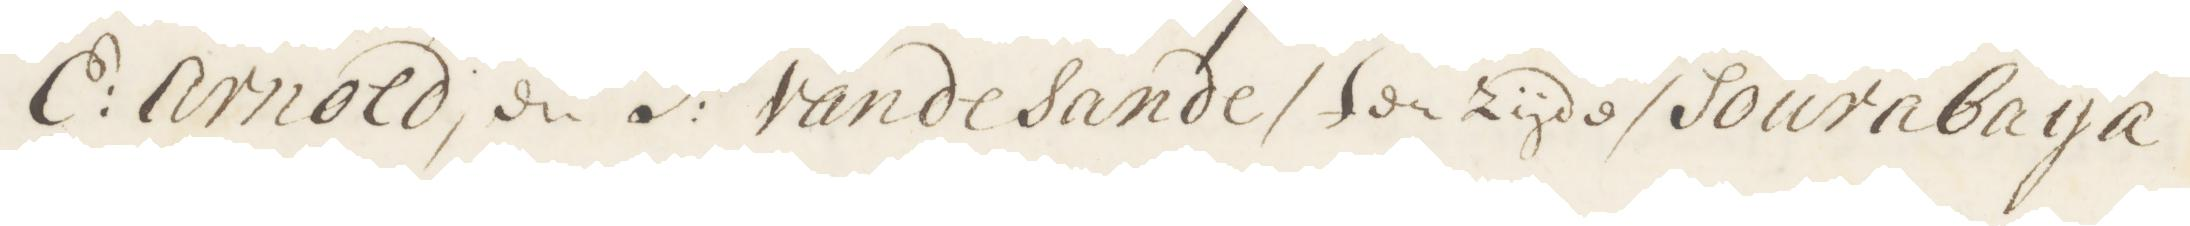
E: arnold, en P: van de sande /ter zijde/ sourabaija
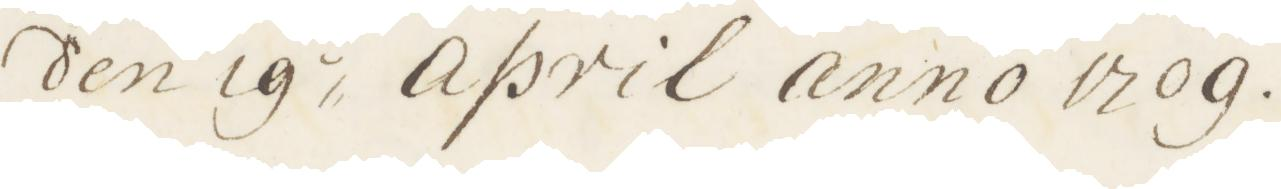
den 19„' april anno 1709.
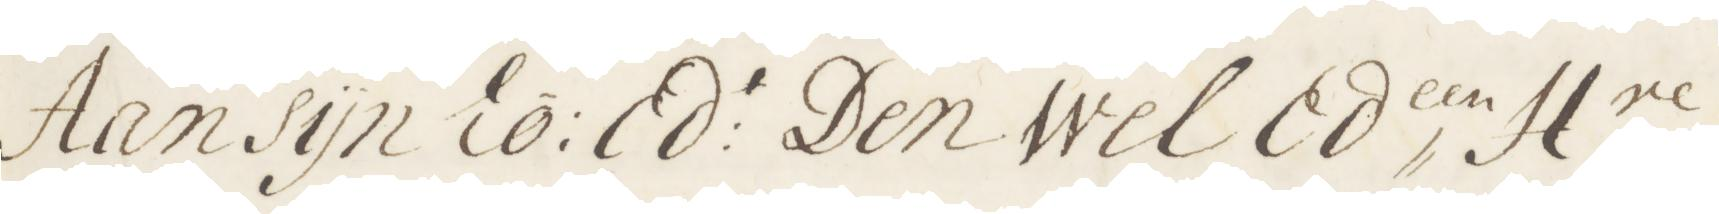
Aan sijn ho: Ed:e Den wel Ed„len H=re
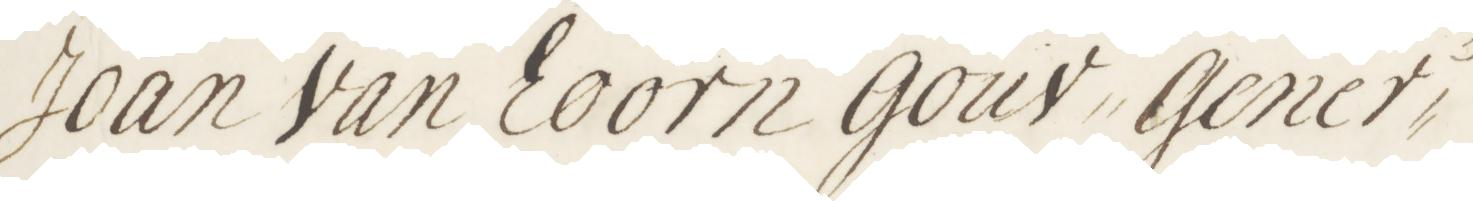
Joan van hoorn gouv„r gener„l
